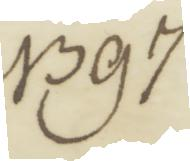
1397
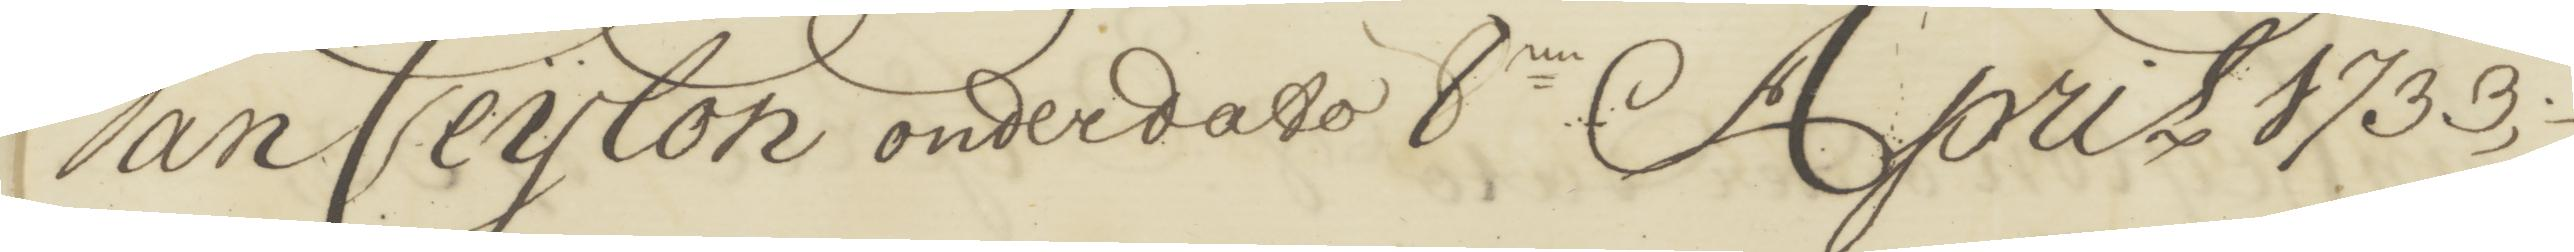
van Ceijlon onder dato 8=´ April 1733;
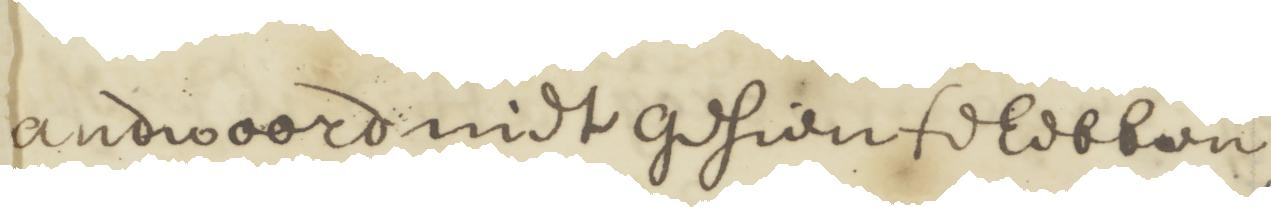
andwoord niet gesien te hebben
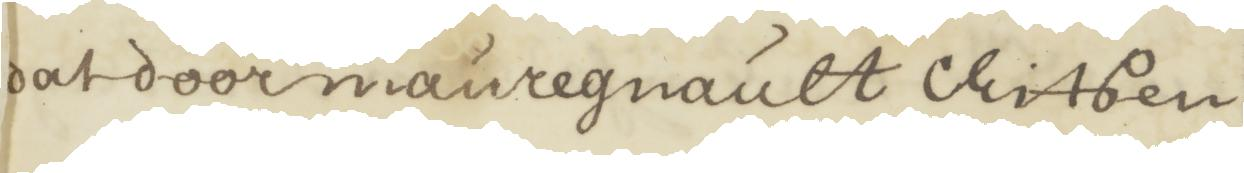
dat door mauregnault chitsen
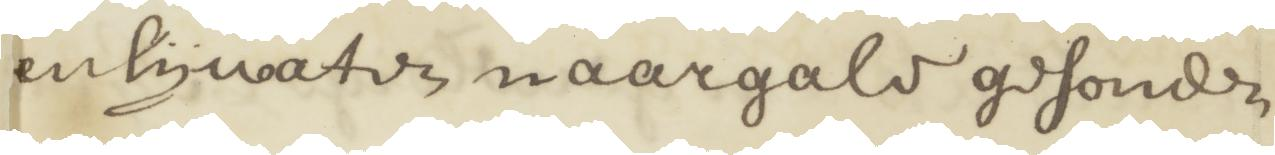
en lijwaten naargale gesonden
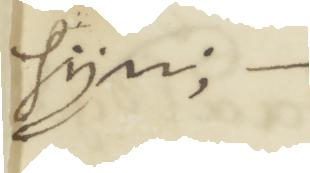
sijn; —
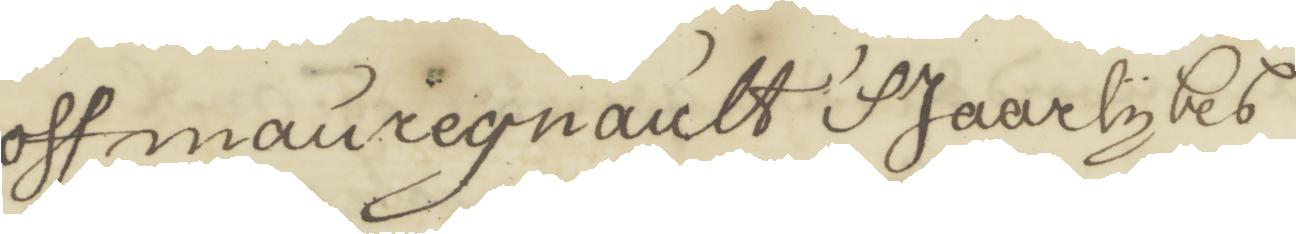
off mauregnault 'S Jaarlijks
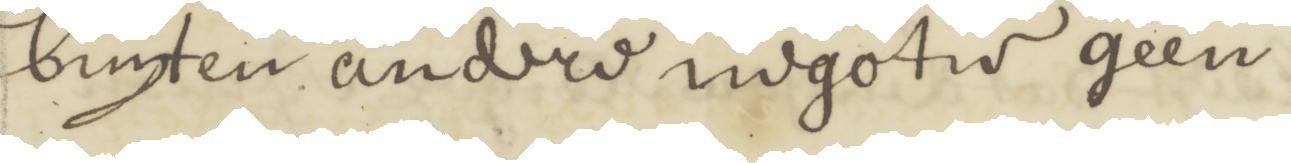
buijten andere negotie geen
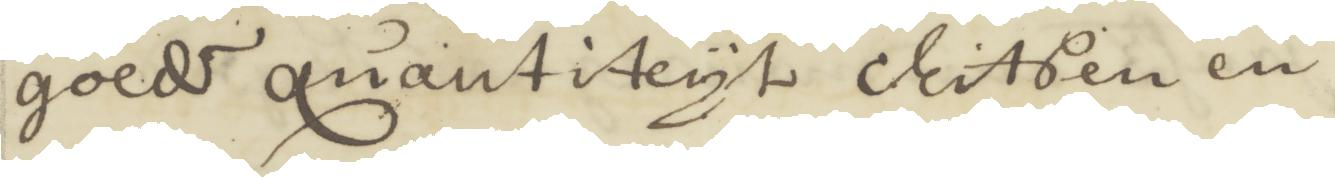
goede quantiteijt chitsen en
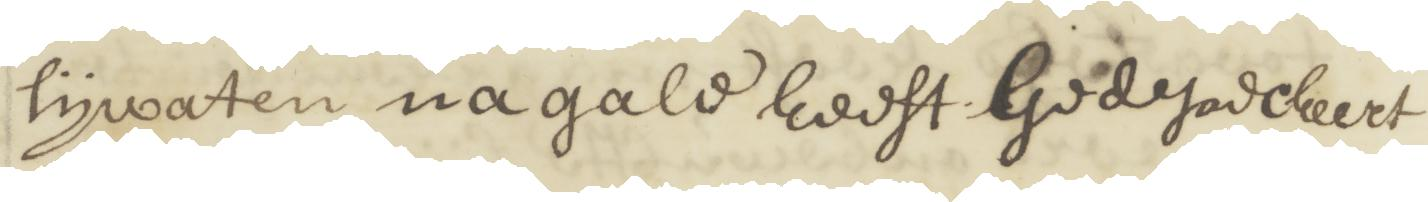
lijwaten na gale heeft Gedepecheert
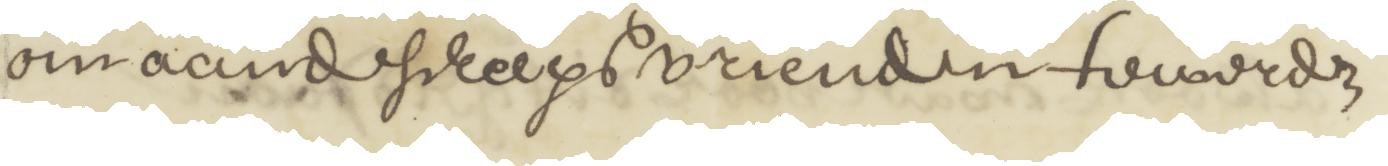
om aan de scheeps vrienden te werden
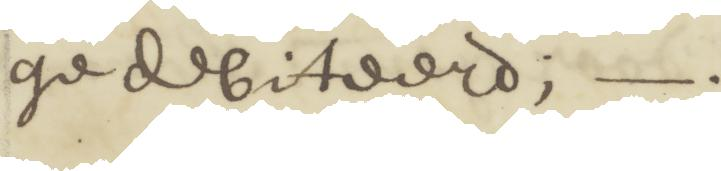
gedebiteerd; —.
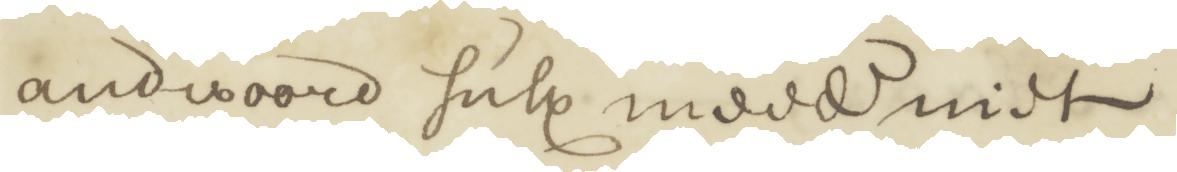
andwoord sulx meede niet
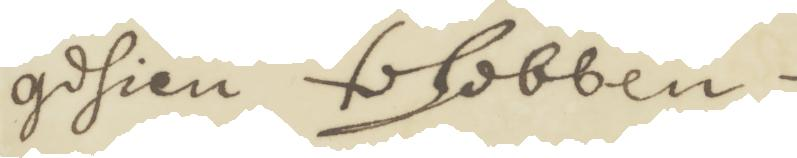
gesien te hebben
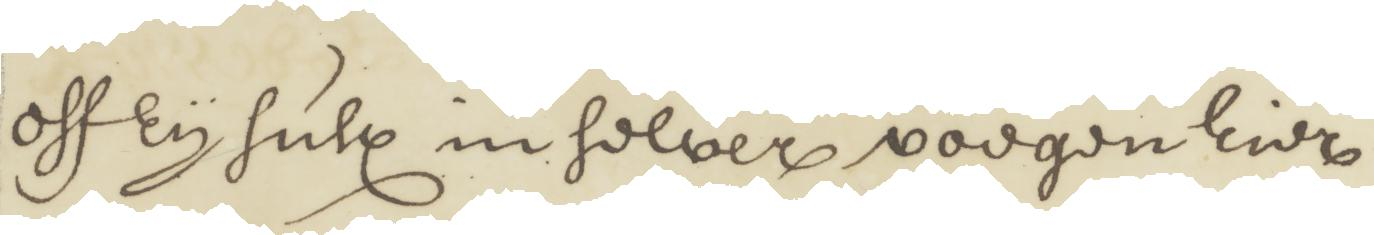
off hij sulx in selver voegen hier
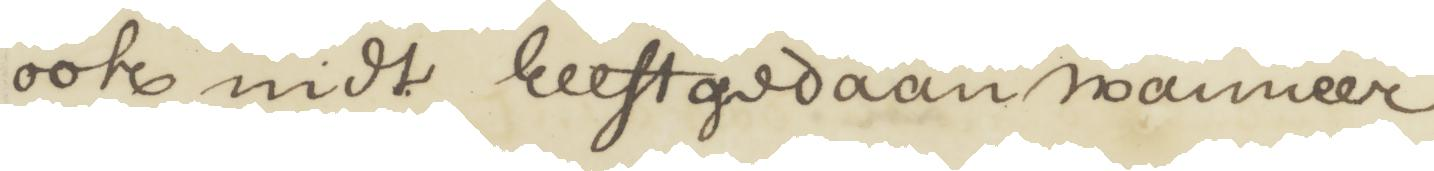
ook niet heeft gedaan wanneer
